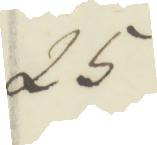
25
